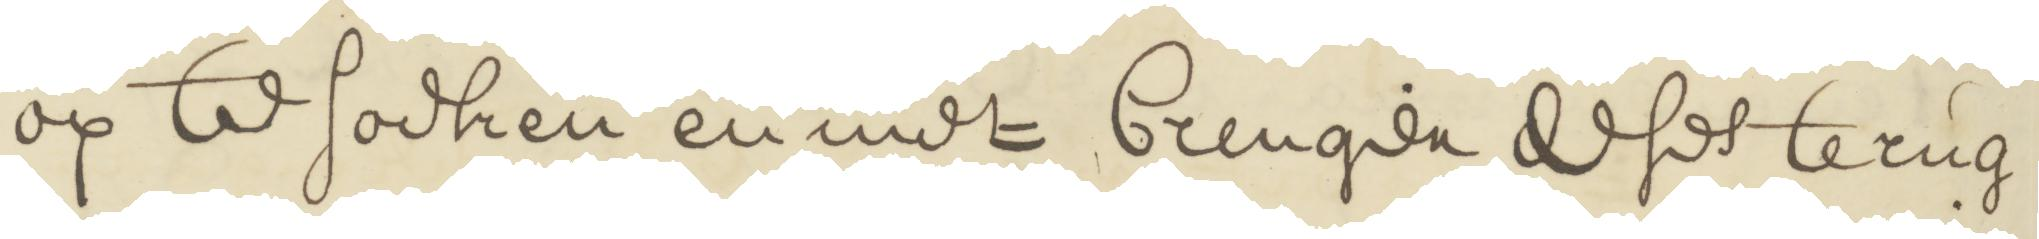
op te soeken en met brenger deses terug
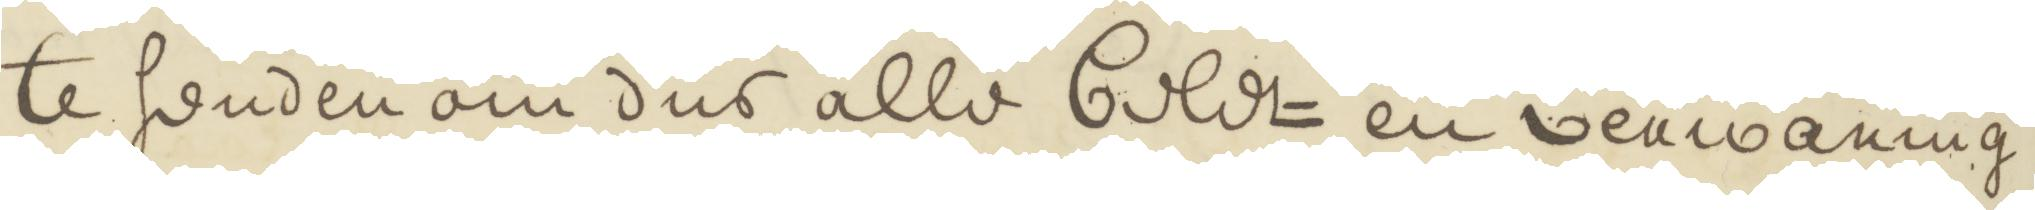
te senden om dus alle belet en verwaring
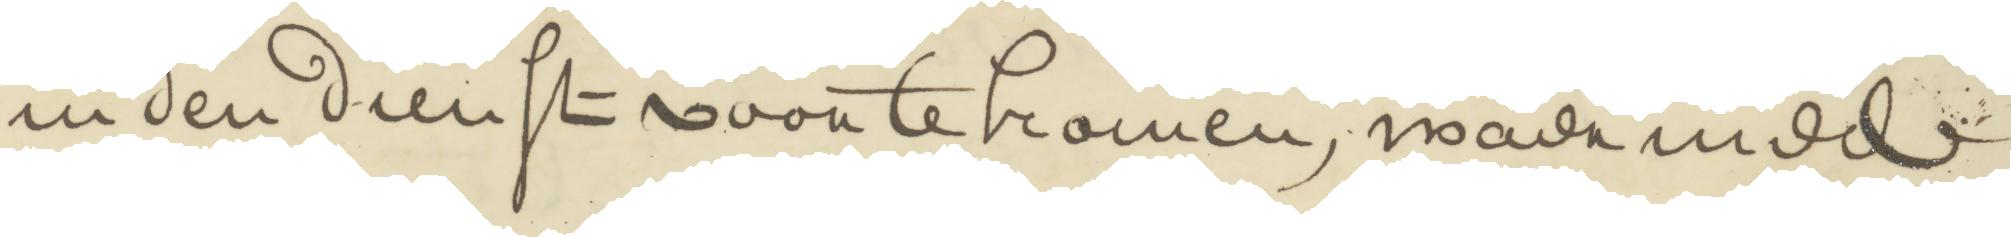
in den dienst voor te komen, waer mede
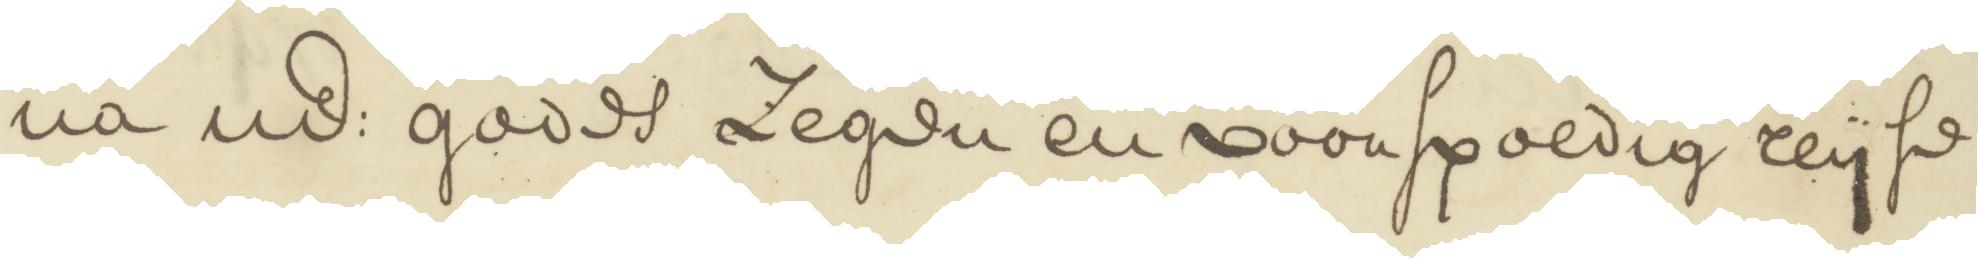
na uE: godes zegen en voorspoedig reijse
